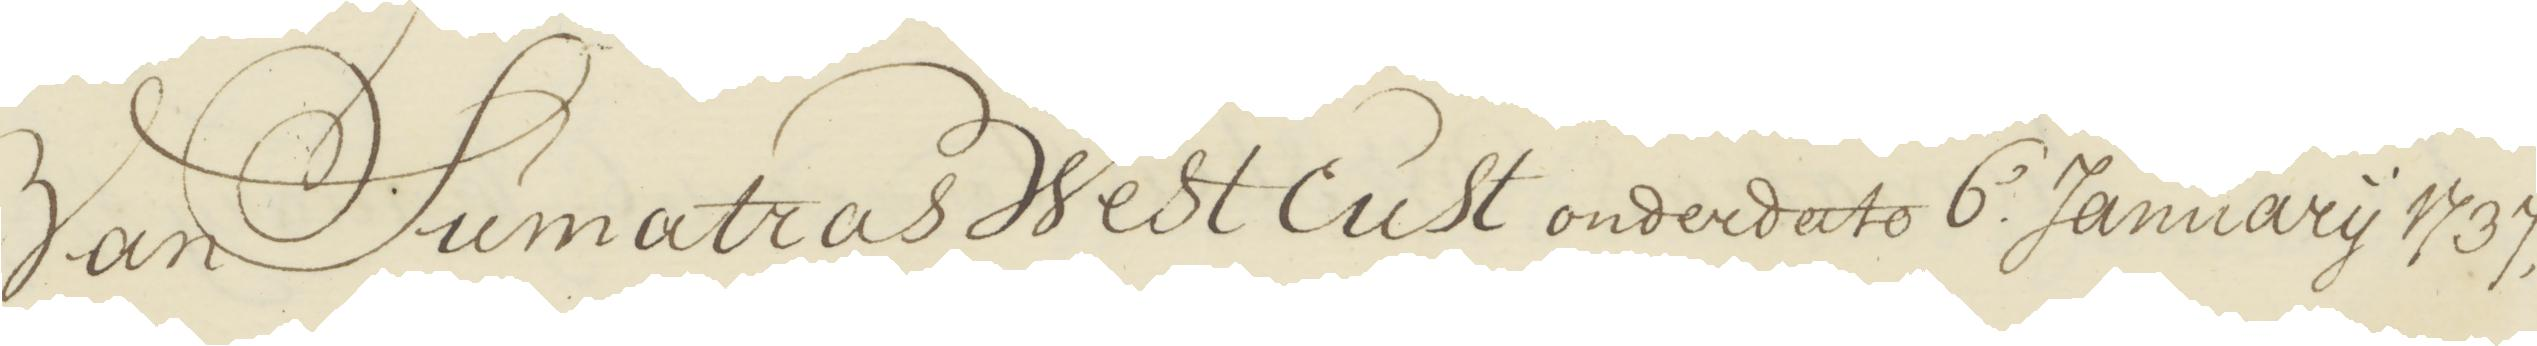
Van Sumatras West Cust onder dato 6.' Januarij 1737
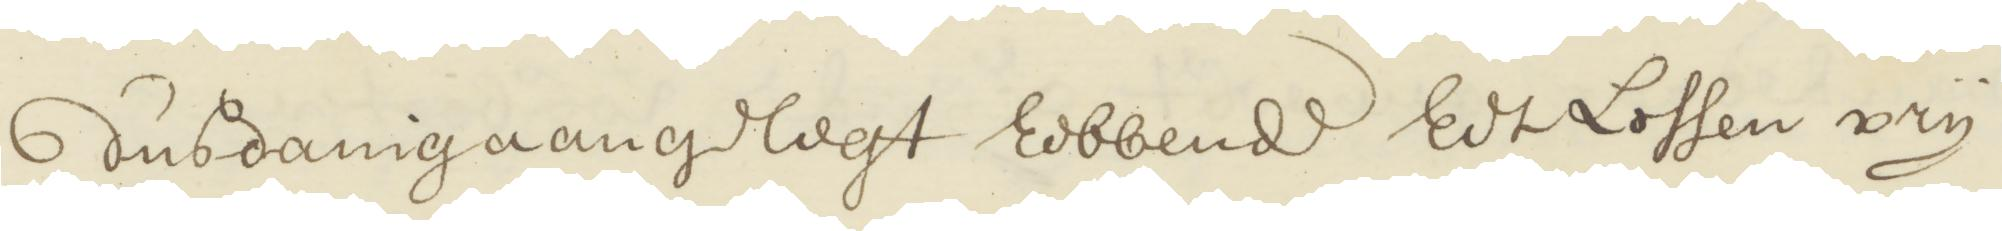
dus danig aangelegt hebbende het Lossen vrij
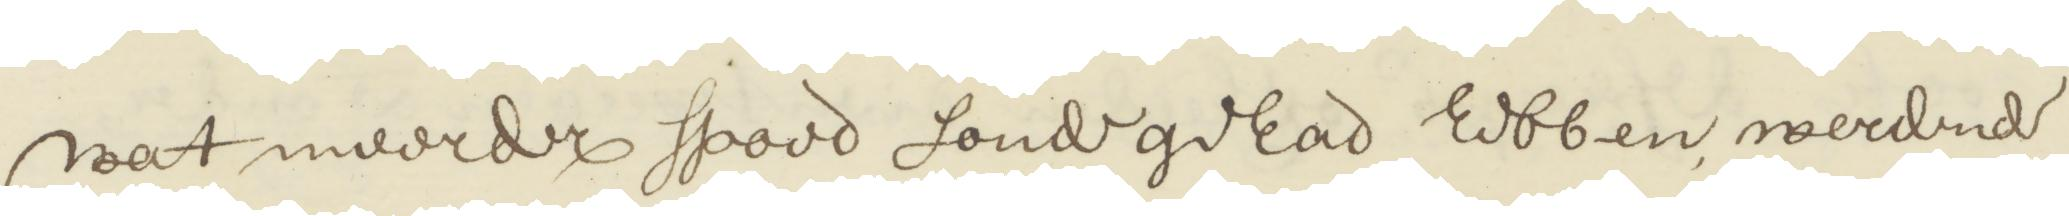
wat meerder spoed soude gehad hebben, werdende
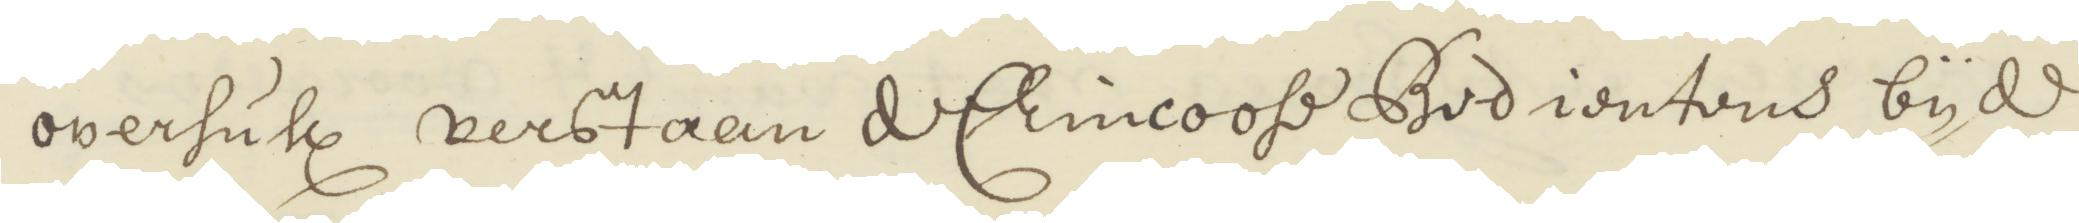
oversulx verstaan de Chincoose Bedientens bij de
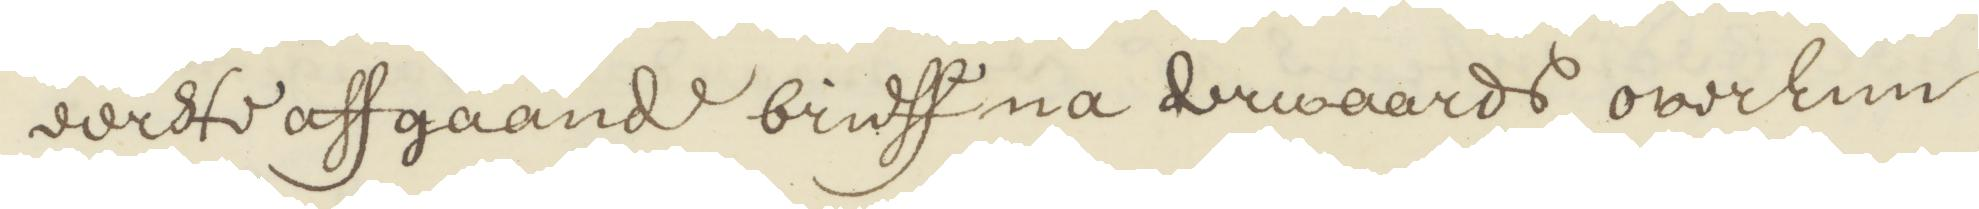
eerste affgaande brieff na derwaards over hun
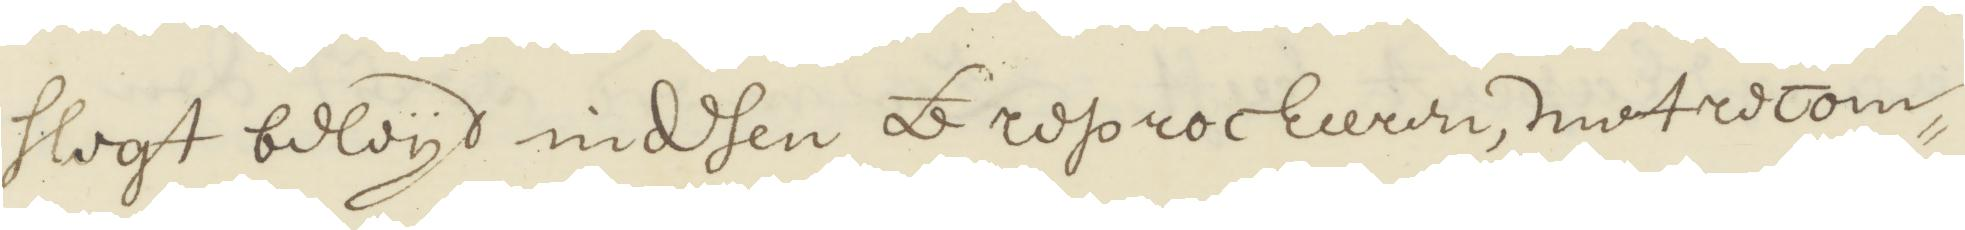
slegt beleijd in desen te reprocheeren, met recom„
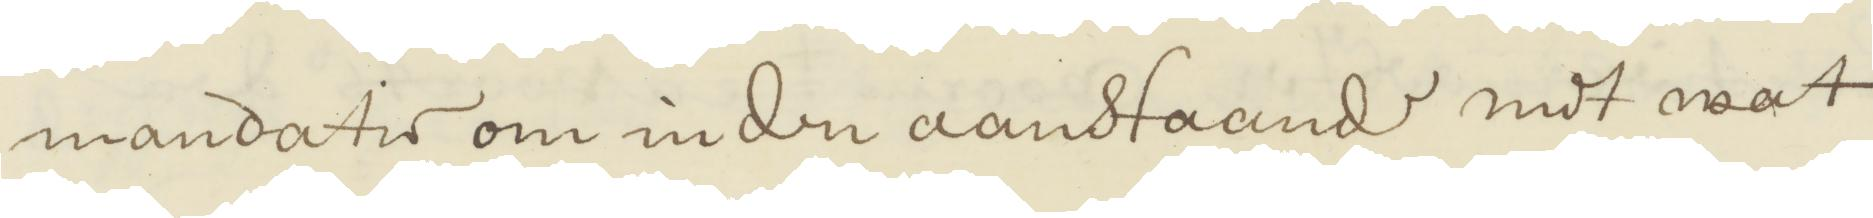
mandatie om in den aanstaande met wat
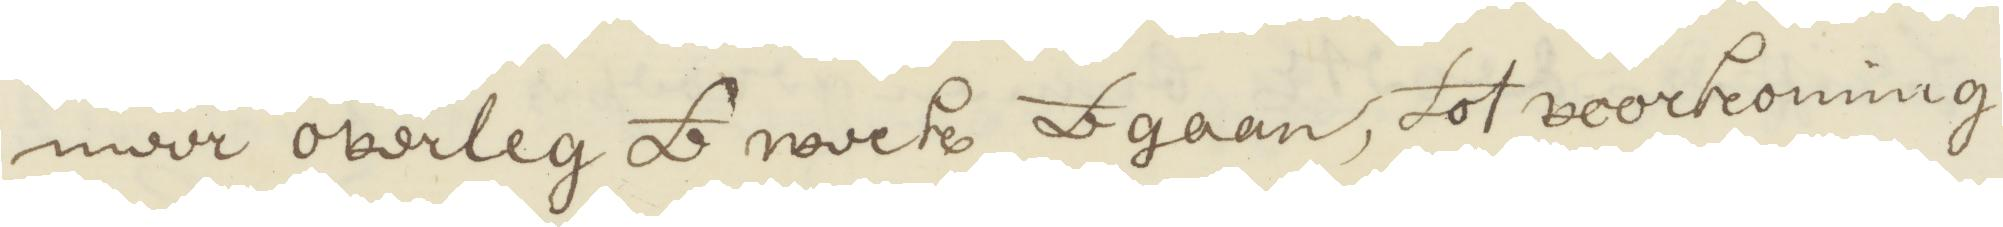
meer overleg te werk te gaan, tot voorkoming
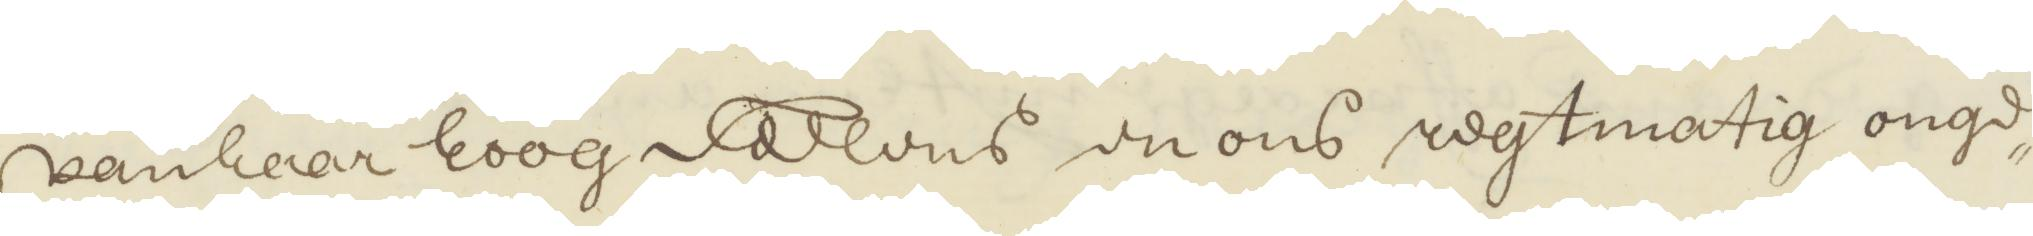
van haar hoog Edelens en ons regtmatig onge„
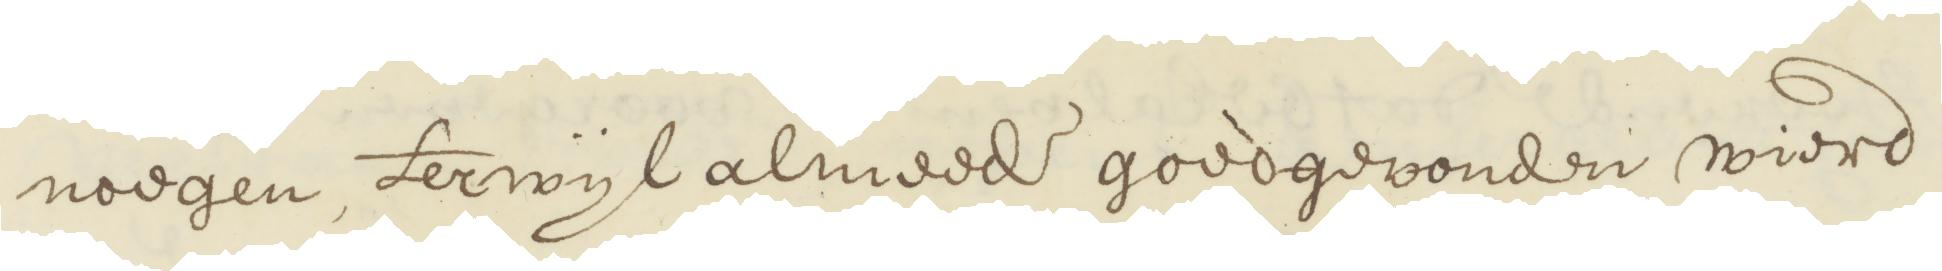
noegen, terwijl almeede goedgevonden wierd
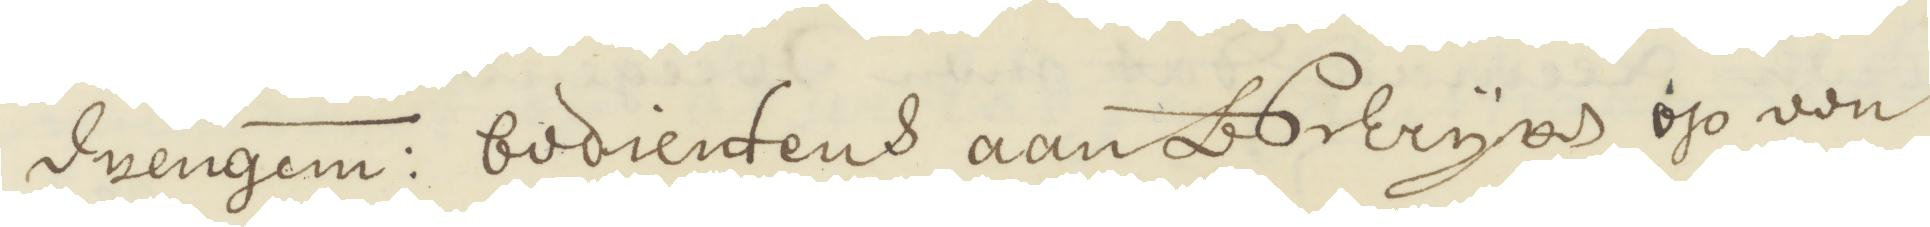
Evengem: bedientens aan teschrijven op een
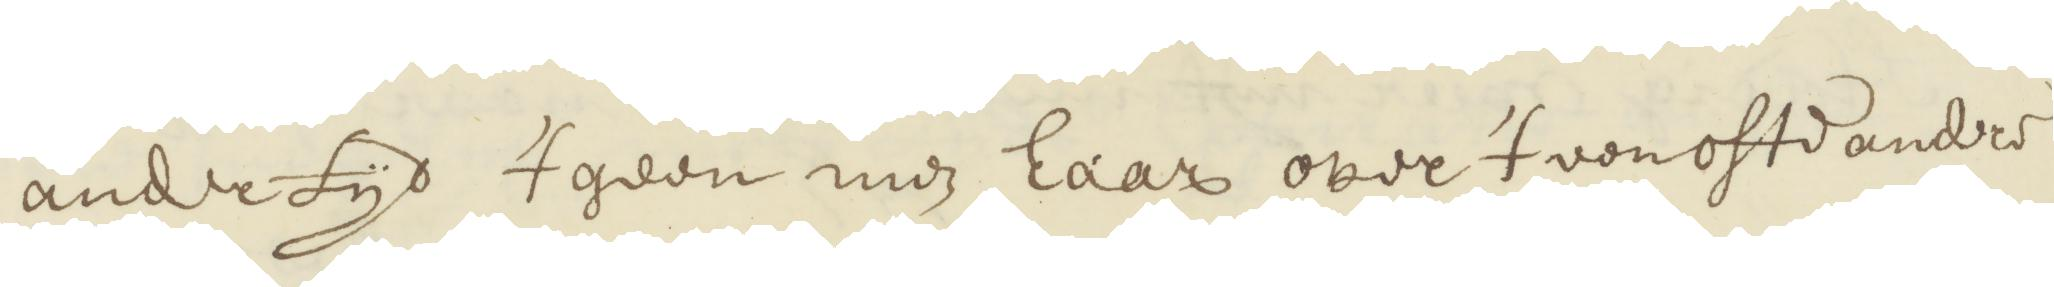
ander tijd 't geen men haar over ’t een ofte andere
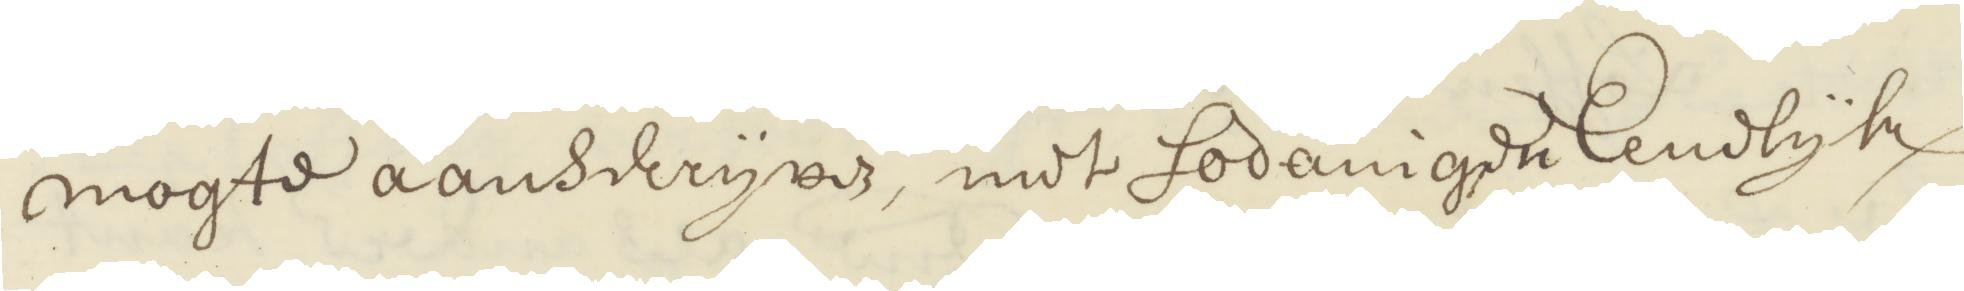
mogte aanschrijven, met sodanigen Eenelijk
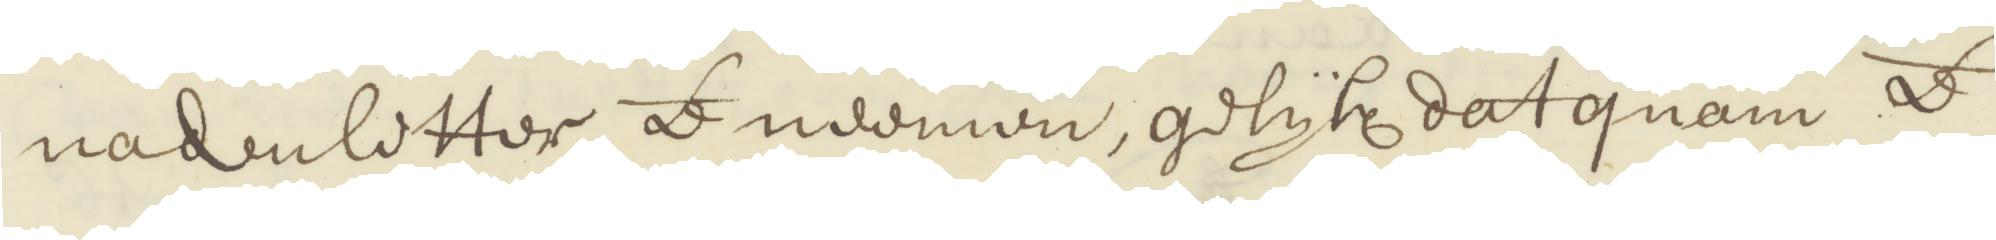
na den letter te neemen, gelijk dat quam te
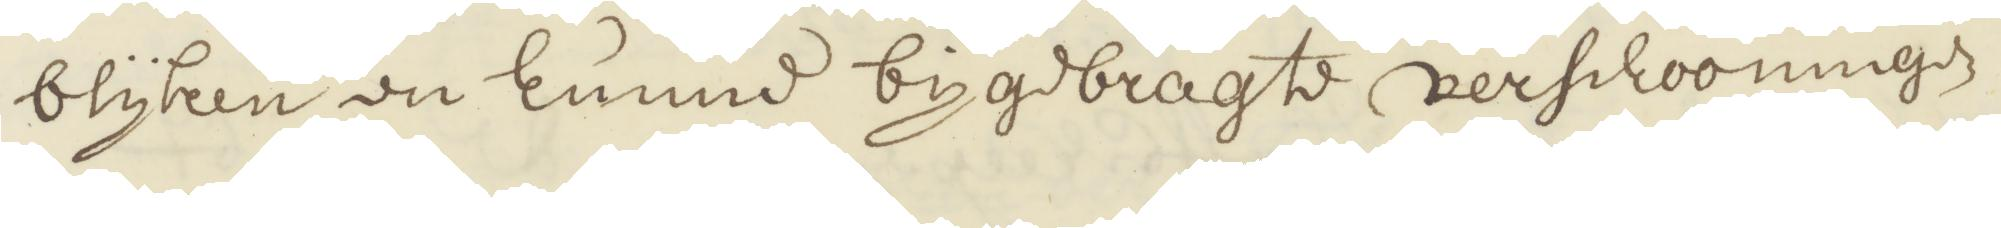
blijken en hunne bijgebragte verschooningen
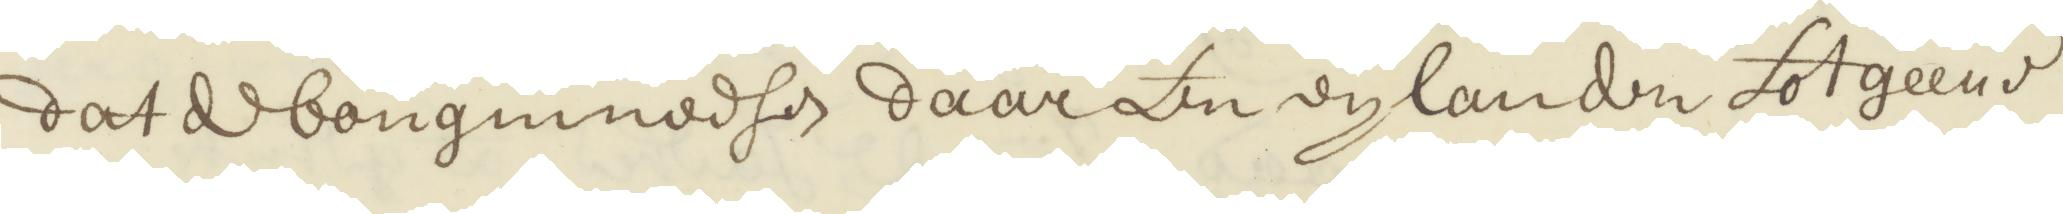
dat de bonguineesen daar ten eijlanden tot geene
